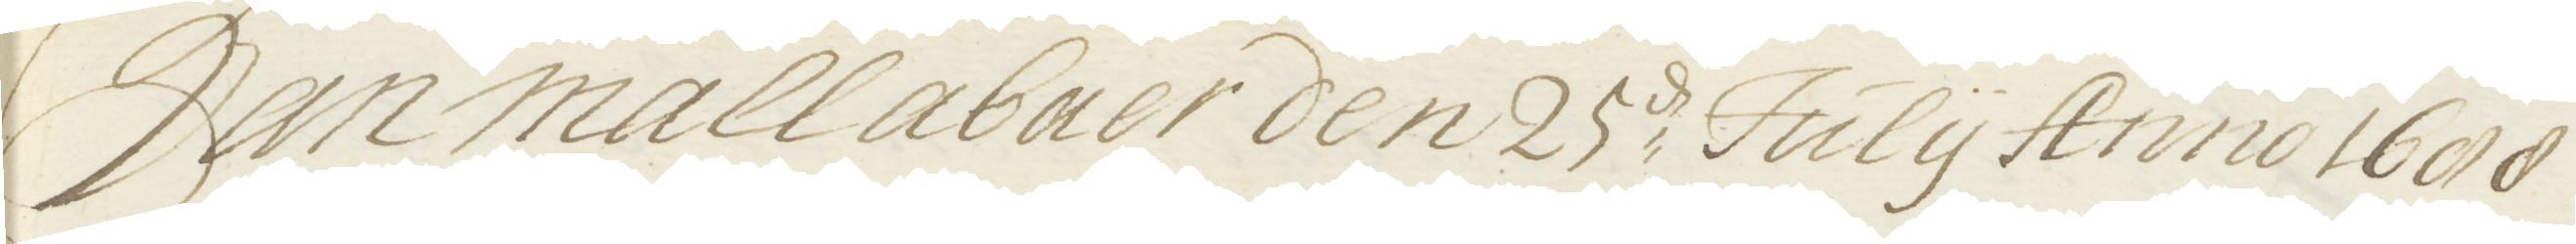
Van Mallabaer den 25„en Iulij Anno 1688
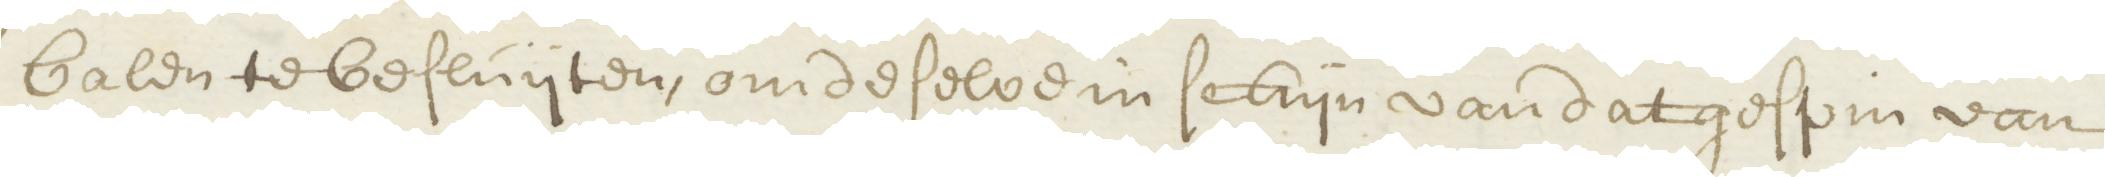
balen te besluijten, om deselve in schijn van dat gespin van
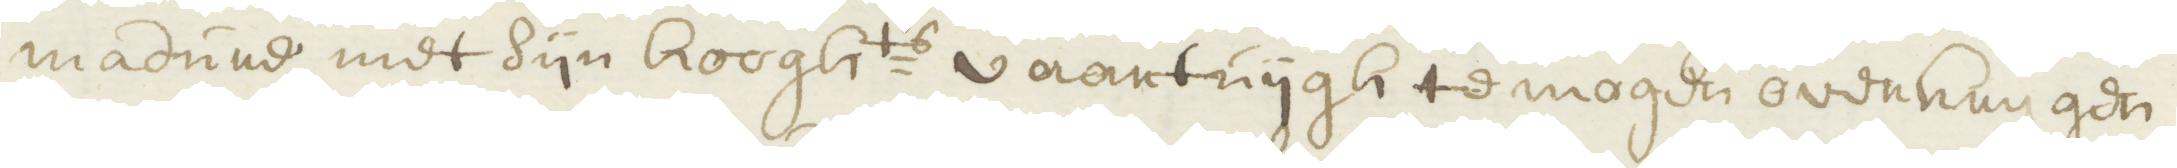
madure met sijn hoogh=ts vaartuijgh te mogen overkrijgen
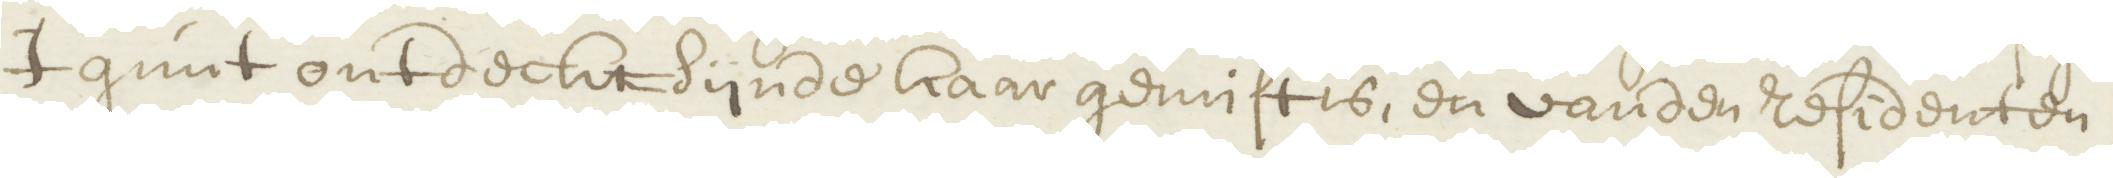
’t gunt ontdeckt sijnde haar gemist is, en van den residenten
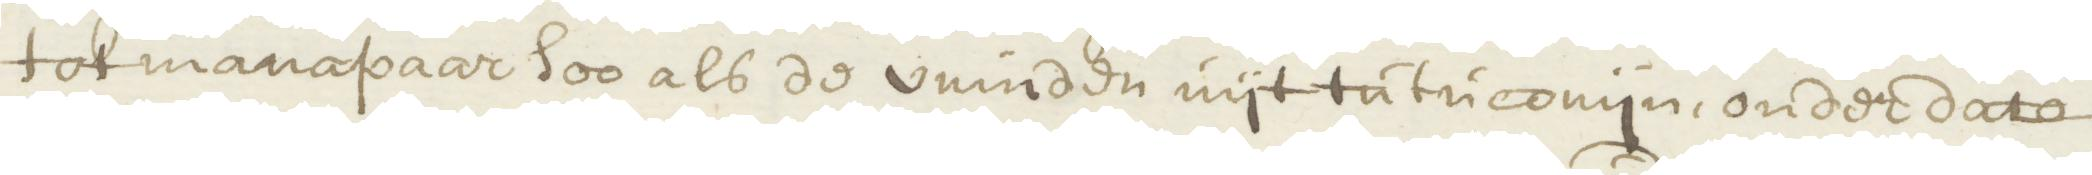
tot manapaar soo als de vrinden uijt tutucorijn, onder dato
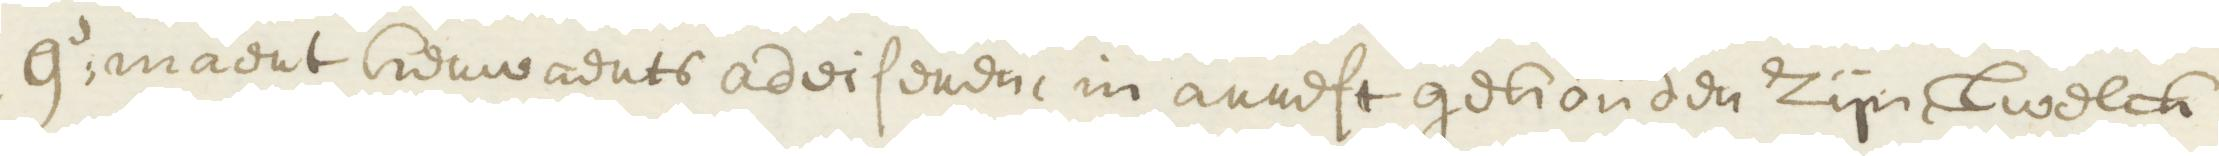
9„' maert herwaerts adviseren, in arrest gehouden zijn twelck
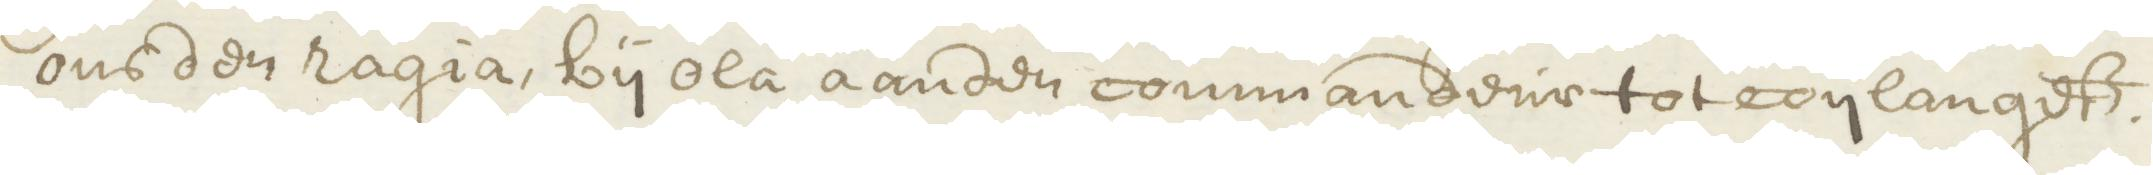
ons den ragia, bij ola aan den commandeur tot coijlan gesz.
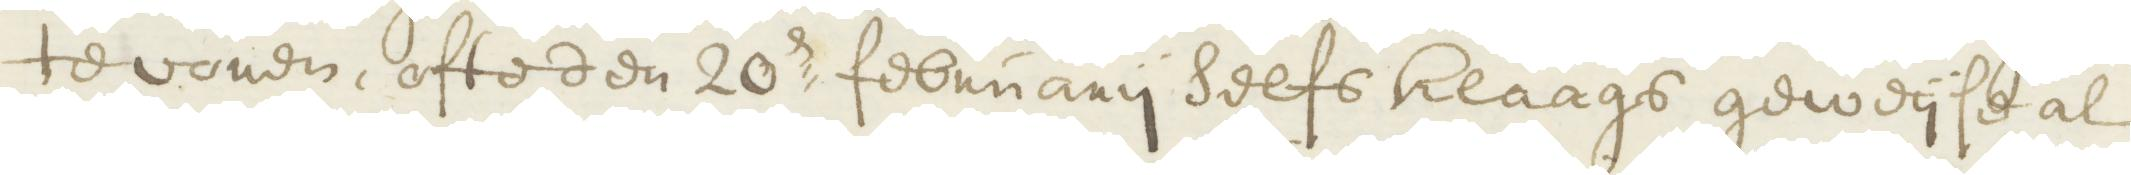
te voren, ofte den 20„en februarij selfs klaags geweijse al
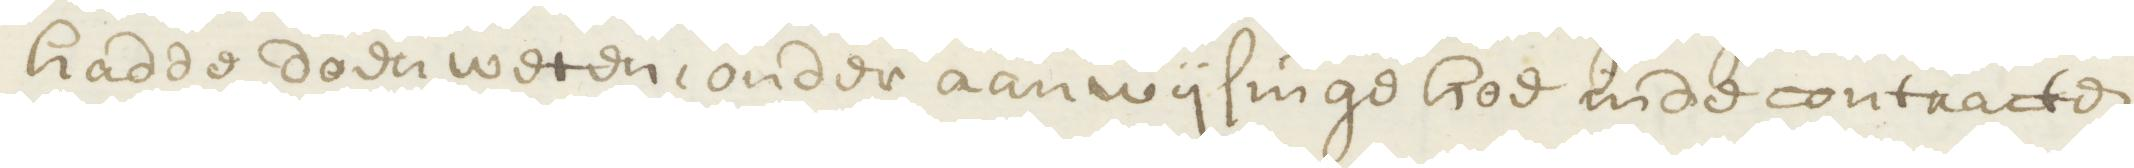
hadde doen weten, onder aanwijsinge hoe inde contracten
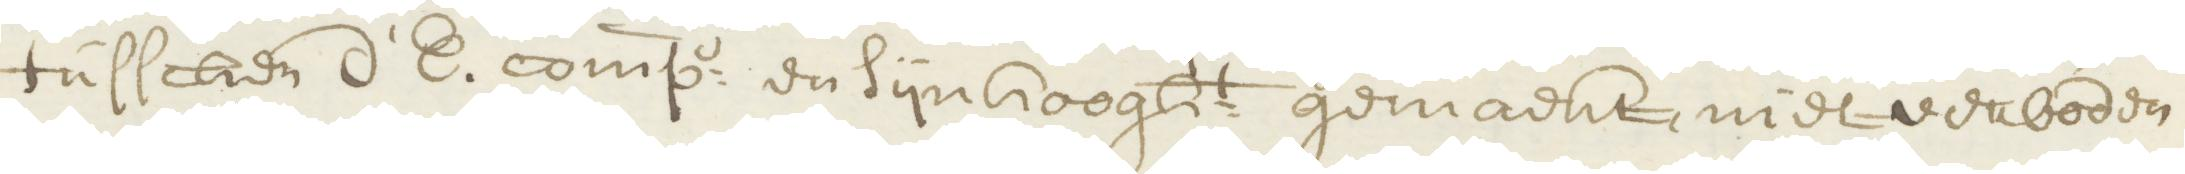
tusschen d’E. comp=s en sijn hoogh=t gemaekt, niet verboden
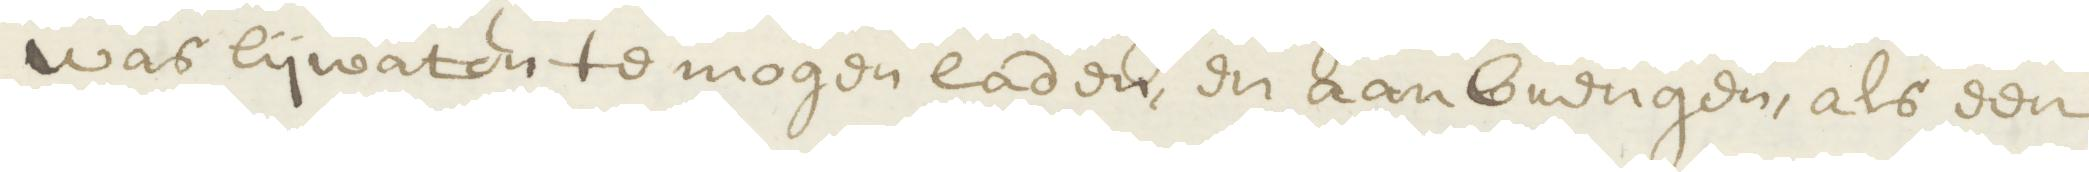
was lijwaten te mogen laden, en aanbrengen, als een
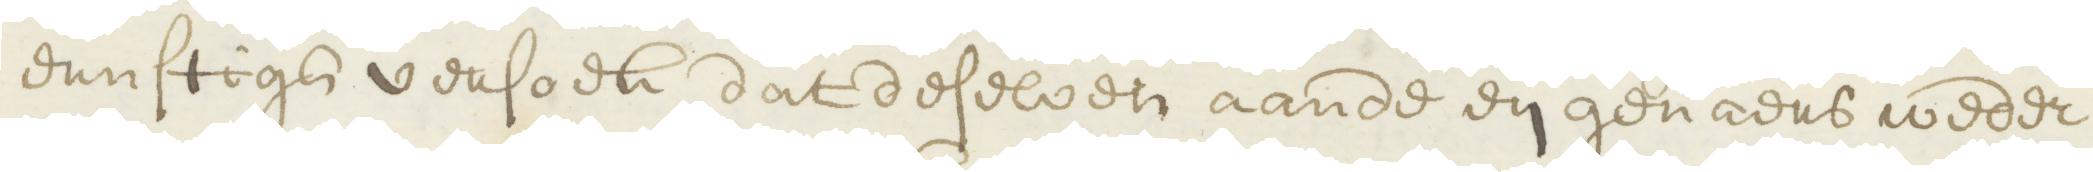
ernstigh versoek dat deselven aan de eijgenaers weder
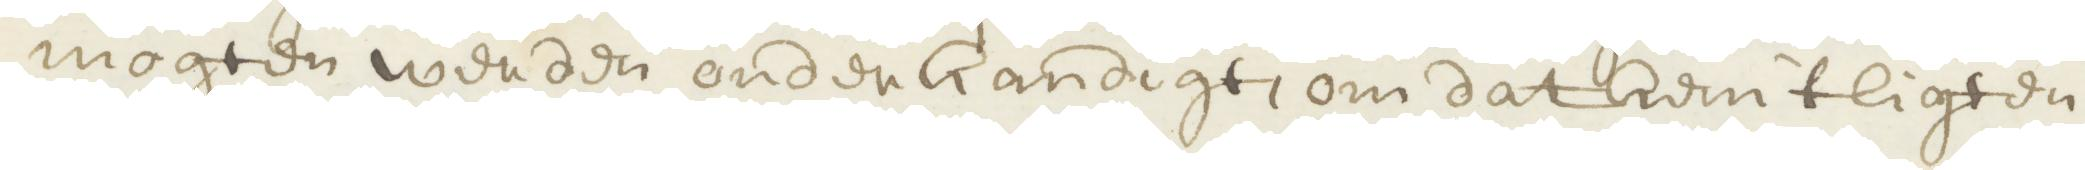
mogten werden onderhandigt, om dat hem 'tligten
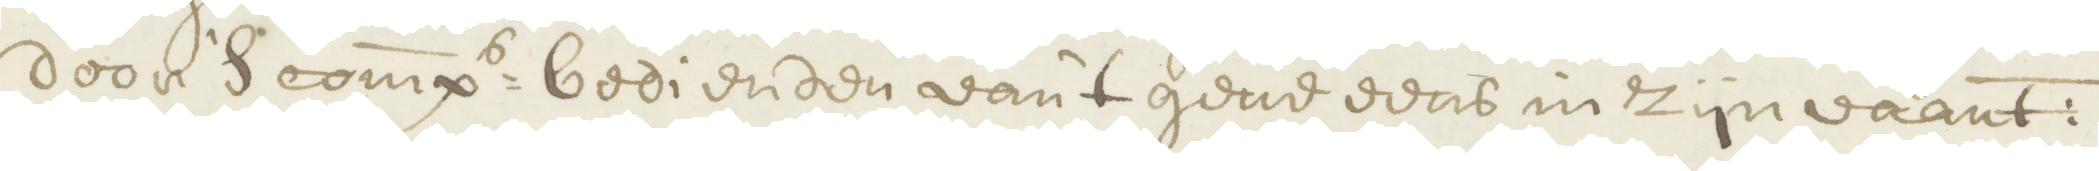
door ’s comp=s bedienden van’t gene eens in zijn vaart:
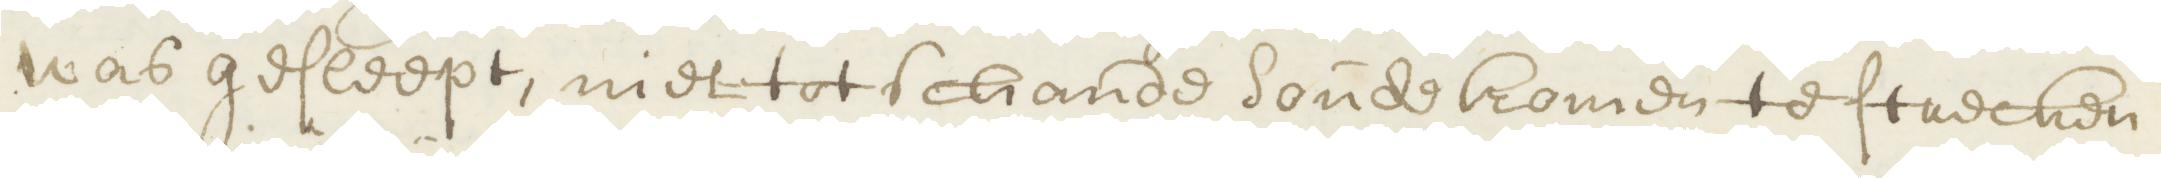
was gesleept, niet tot schande soude komen te strecken
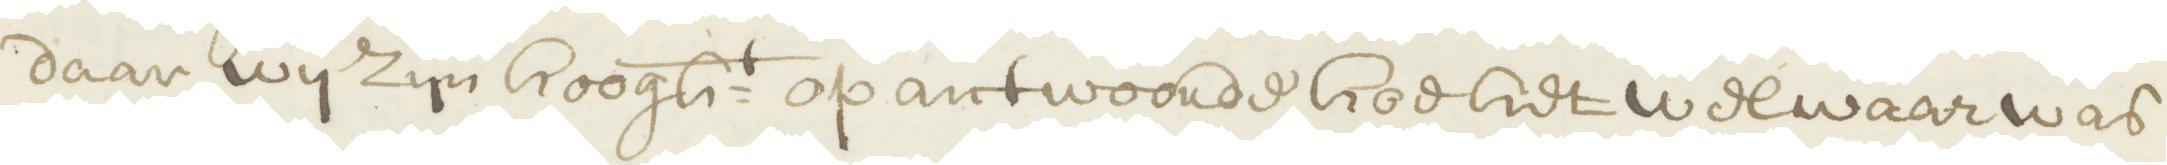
daar wij zijn hoogh=t op antwoorde hoe het welwaar was
